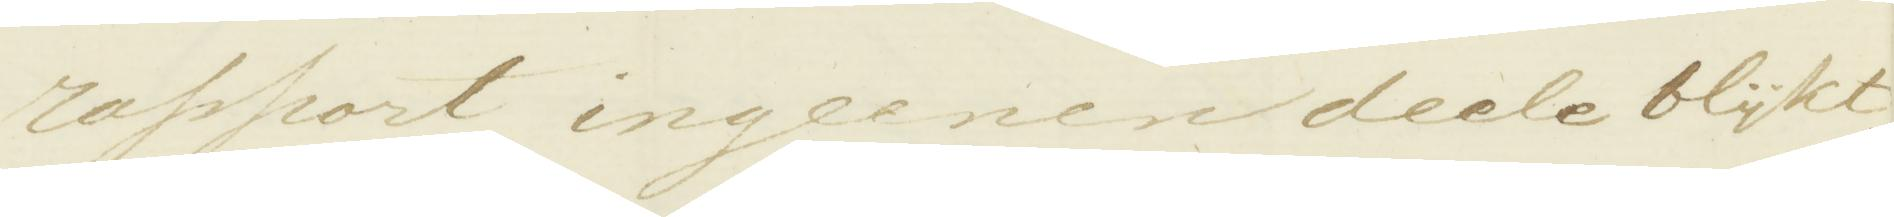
rapport ingeenen deele blijkt,
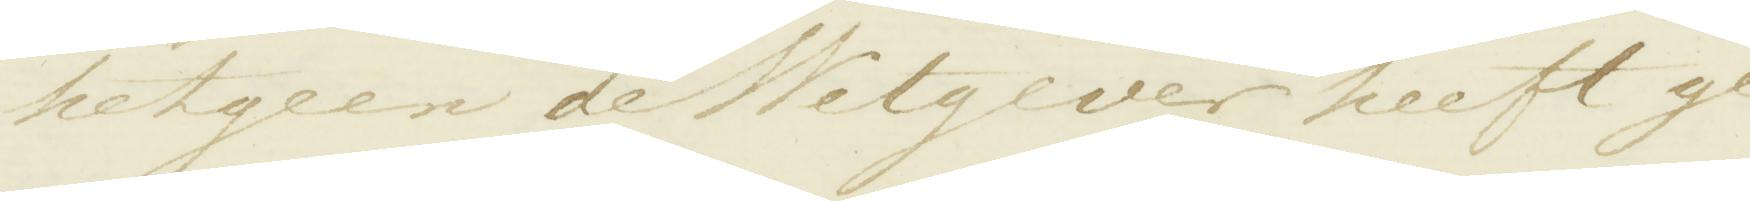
hetgeen de Wetgever heeft ge
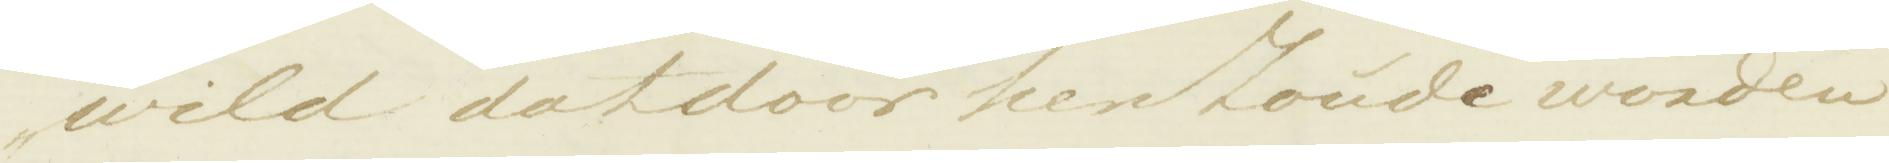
„wild dat door hen zoude worden
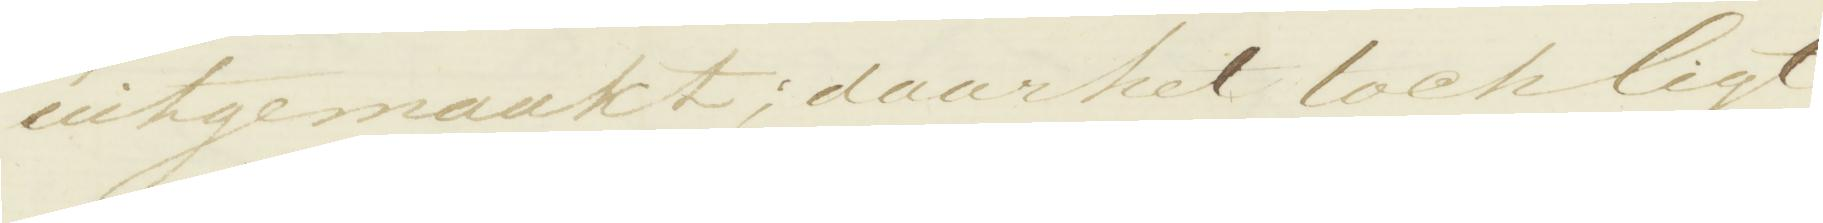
uitgemaakt; daar het toch ligt
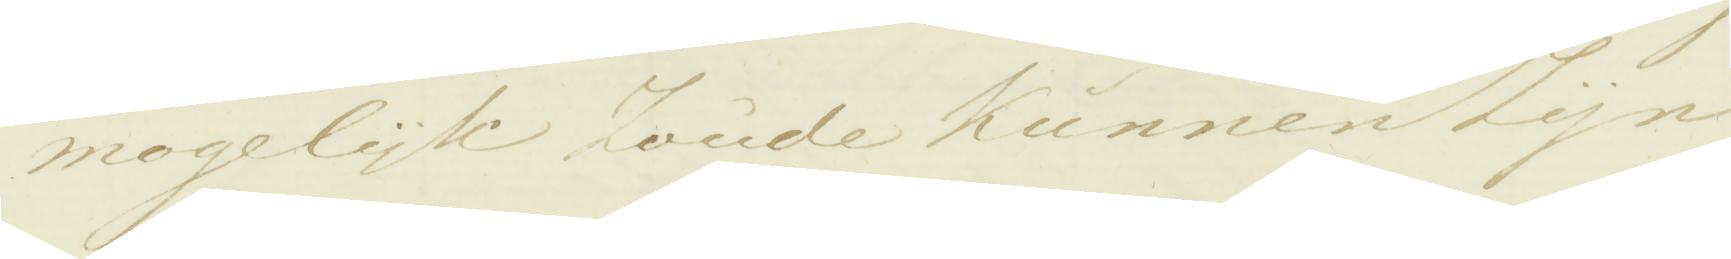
mogelijk zoude kunnen zijn,
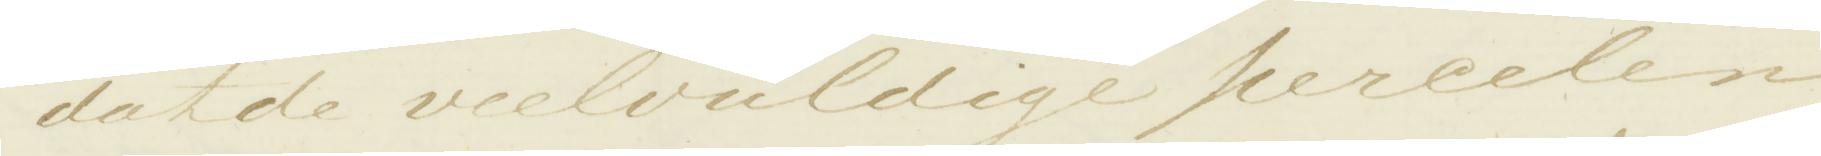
dat de veelvuldige percelen
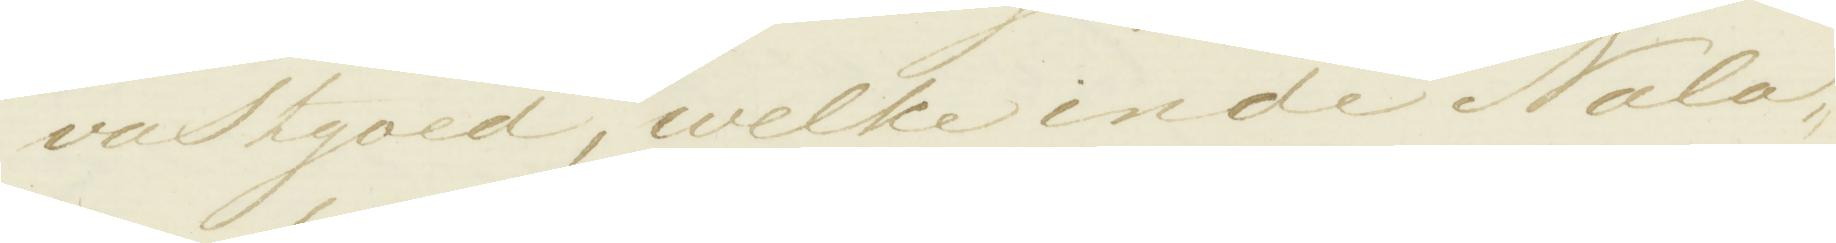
vastgoed, welke in de Nala„
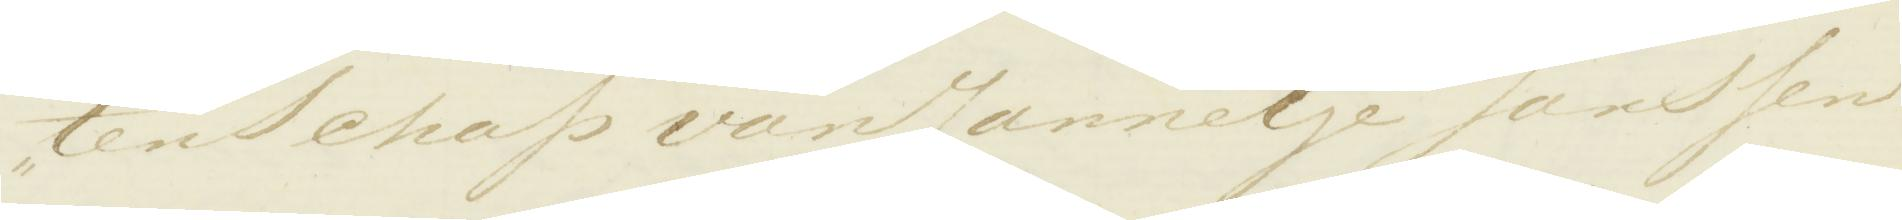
„tenschap van Jannetje Janssen
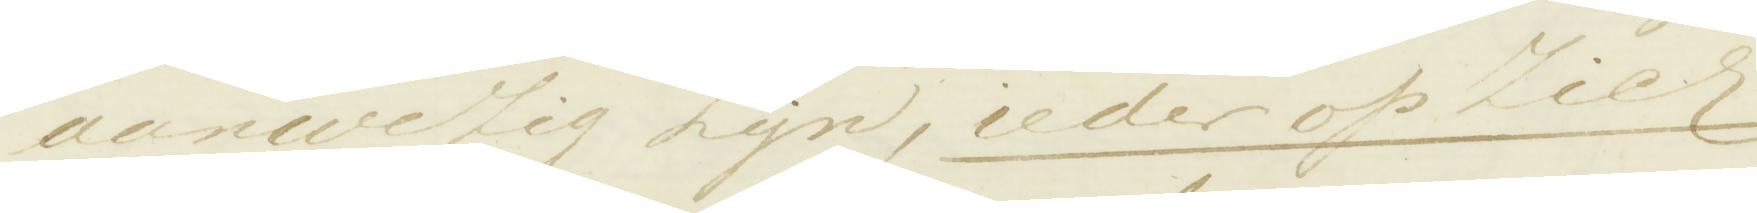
aanwezig zijn, ieder op zich
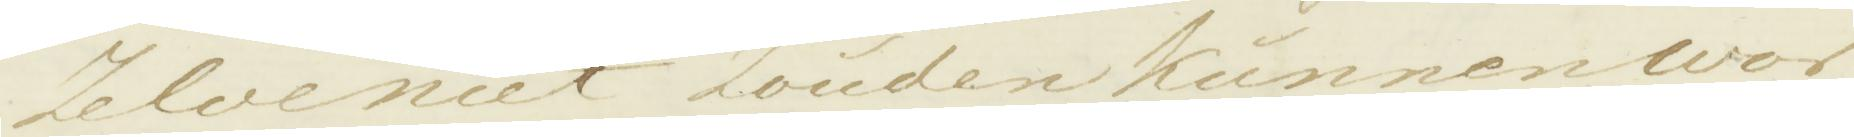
zelve niet zouden kunnen wor
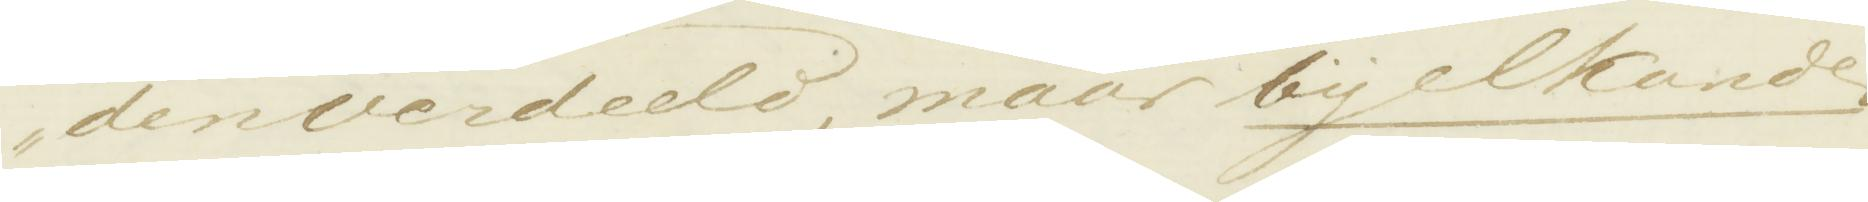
„den verdeeld, maar bij elkander
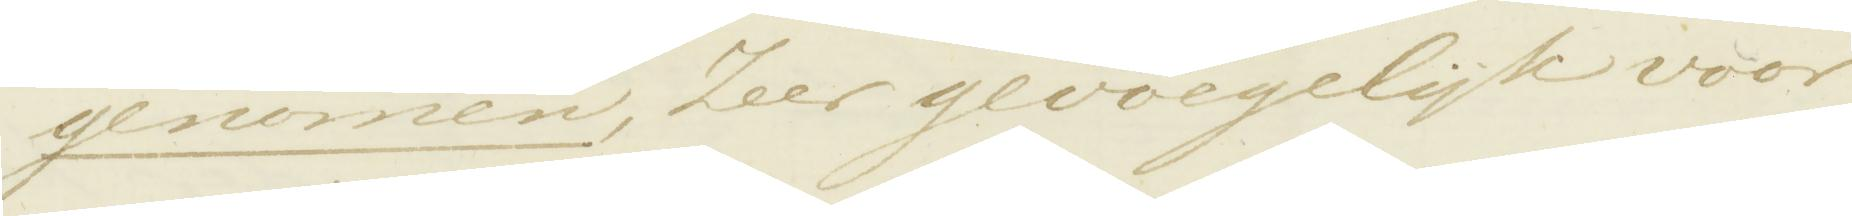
genomen, zeer gevoegelijk voor
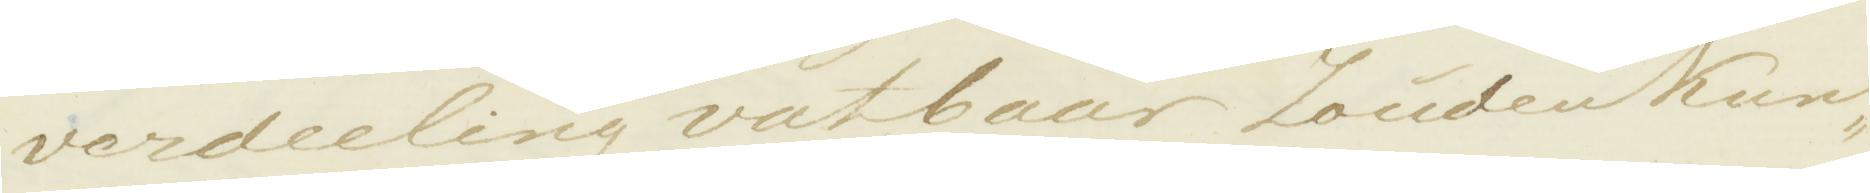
verdeeling vatbaar zouden kun„
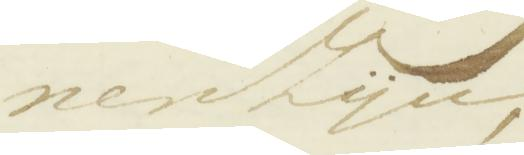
nen zijn;
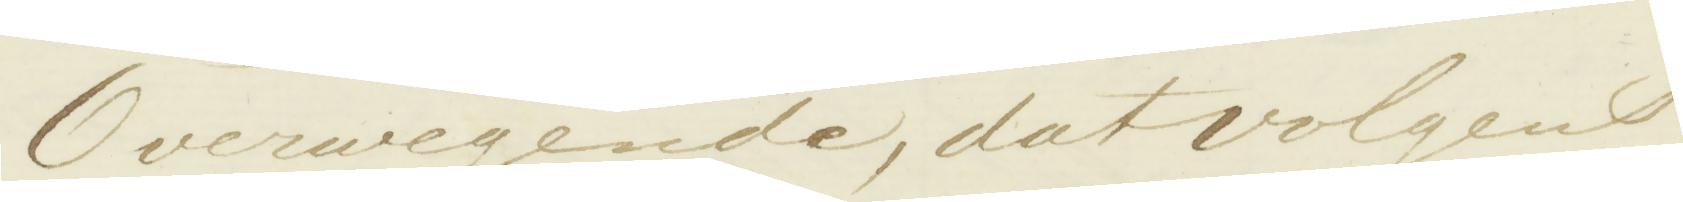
Overwegende, dat volgens
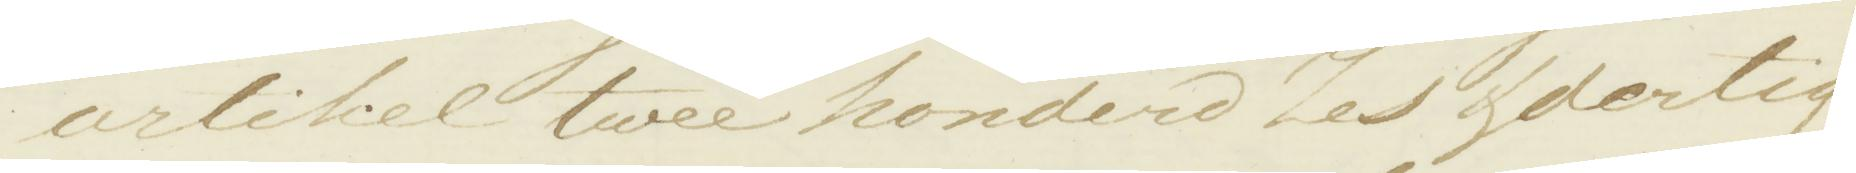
artikel twee honderd zes & dertig
